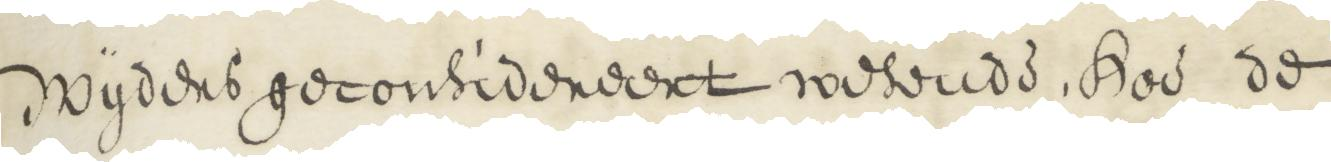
wijders geconsidereert wesende, hoe de
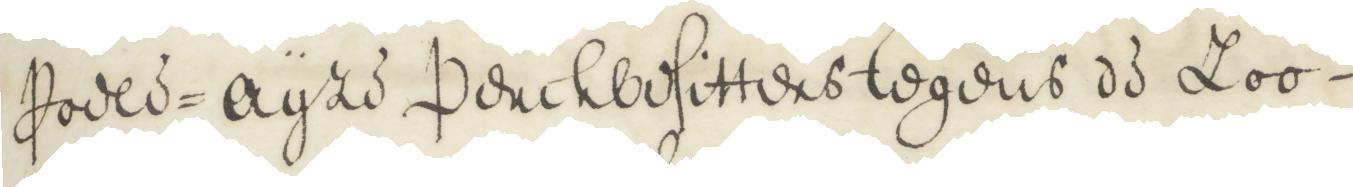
Poele=aijze Perckbesitters tegens de zoo –
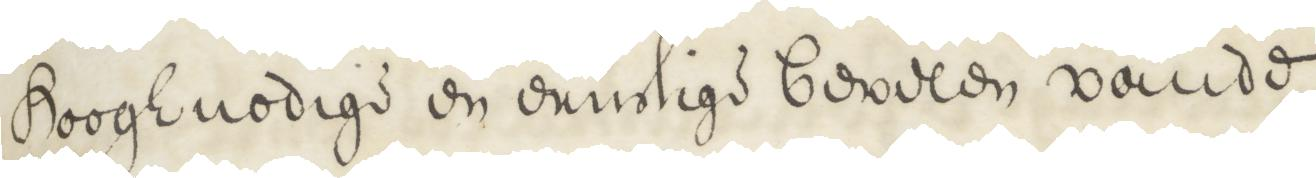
hoogh nodige en ernstige bevelen vande
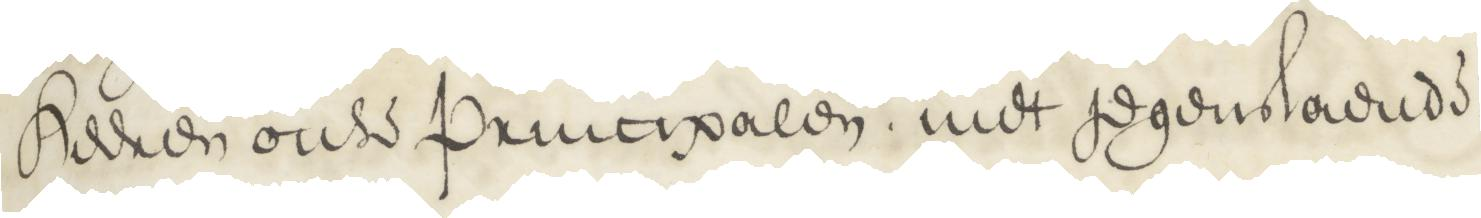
Heeren onse Principalen niet jegenstaende
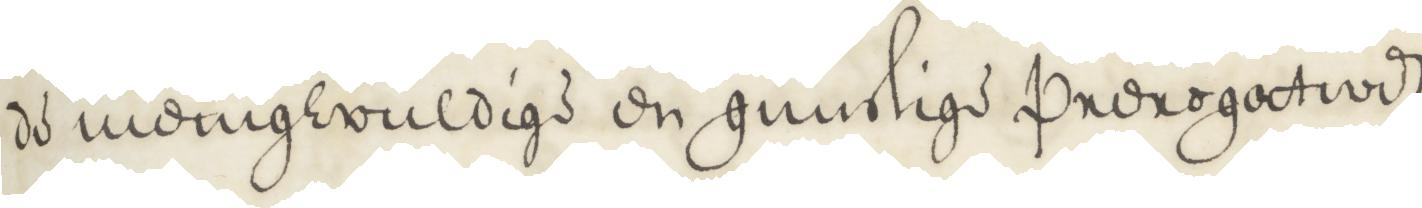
de menighvuldige en gunstige Prerogative
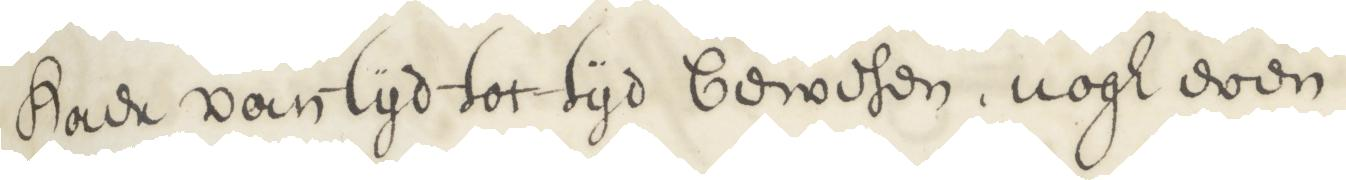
Haer van tijd tot tijd bewesen, nogh even
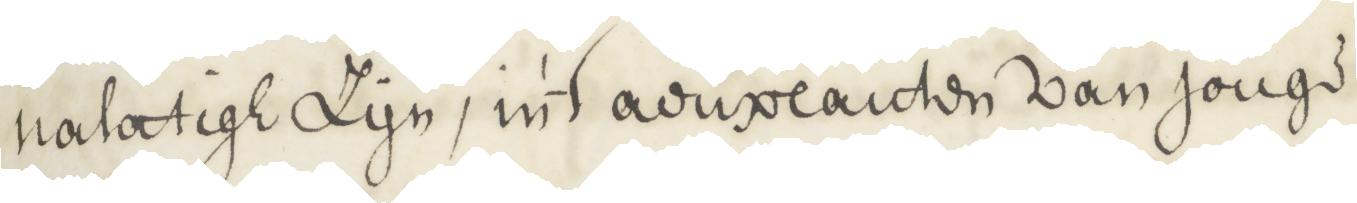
nalatigh zijn, in 't aenplanten van jonge
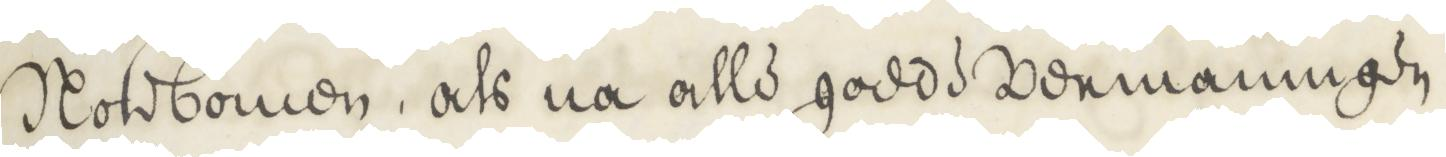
Notebomen, als na alle goede vermaningen
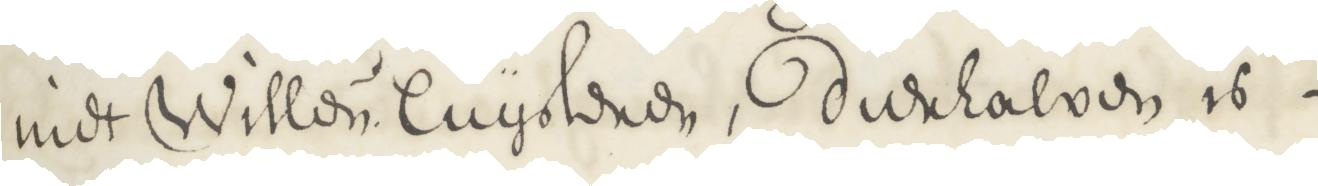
niet Willen luijsteren, dierhalven is
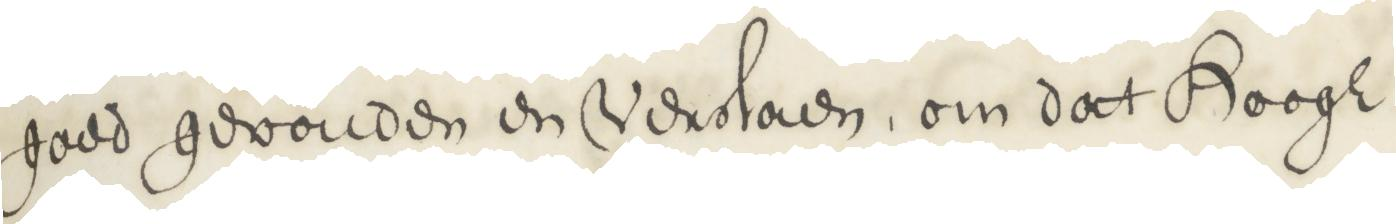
goed gevonden en verstaen, om dat Hoogh
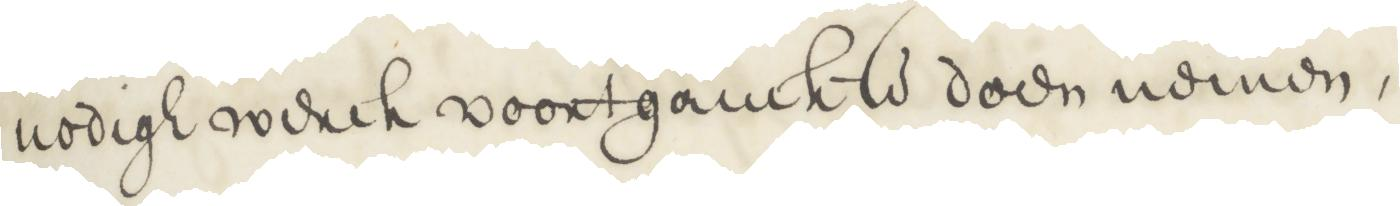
nodigh werck voortganck te doen nemen,
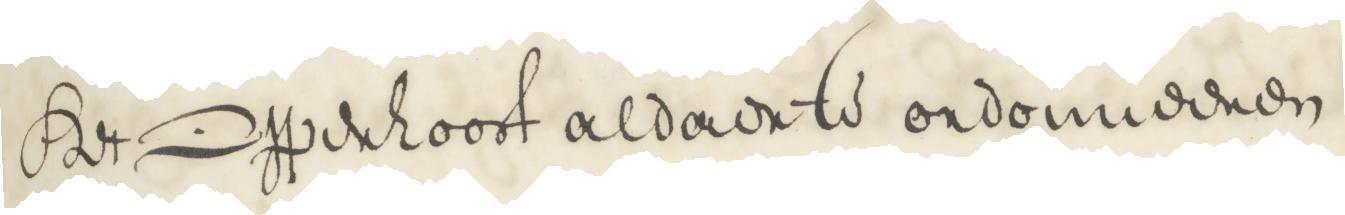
Het Opperhoosf aldaer te ordonneeren
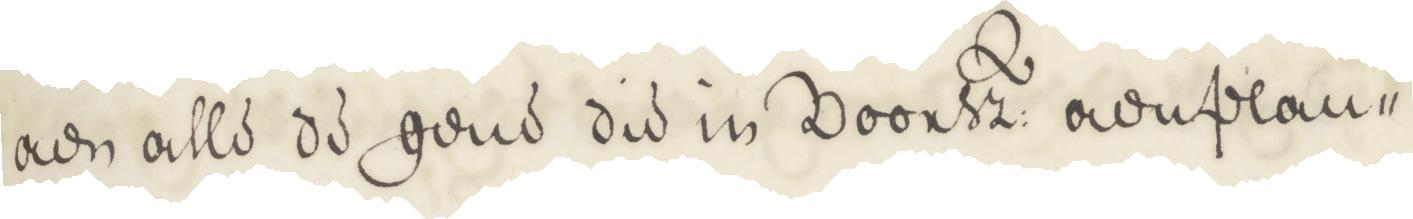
aen alle de gene die in voorsz: aenplan„
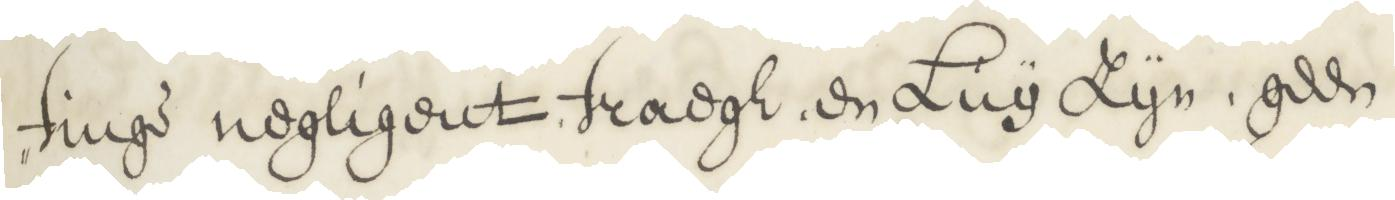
„tinge negligent, traegh, en Luij zijn, geen
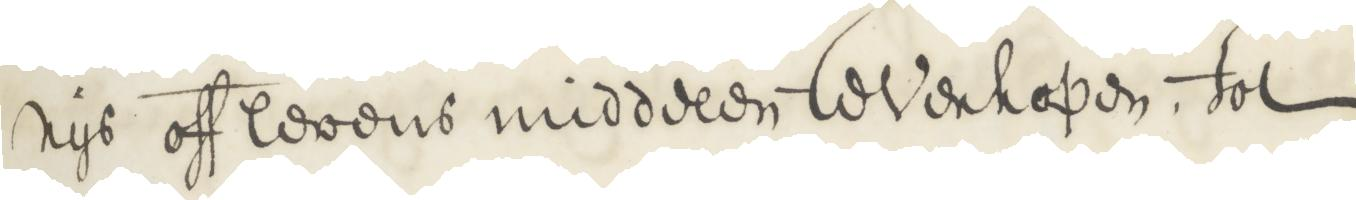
rijs off levens middelen te verkopen, tot
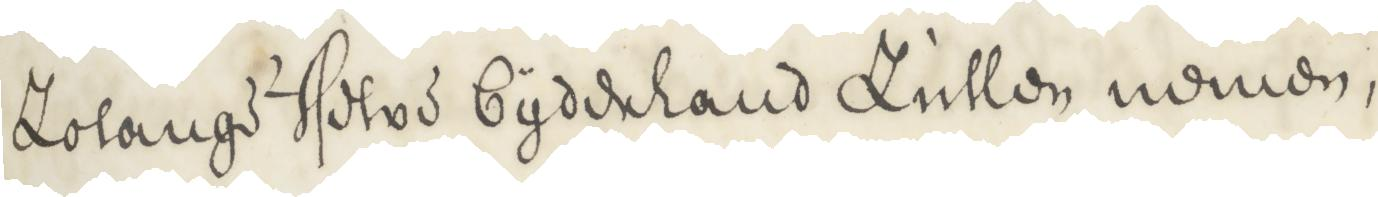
zolange 'tselve bijderhand zullen nemen,
